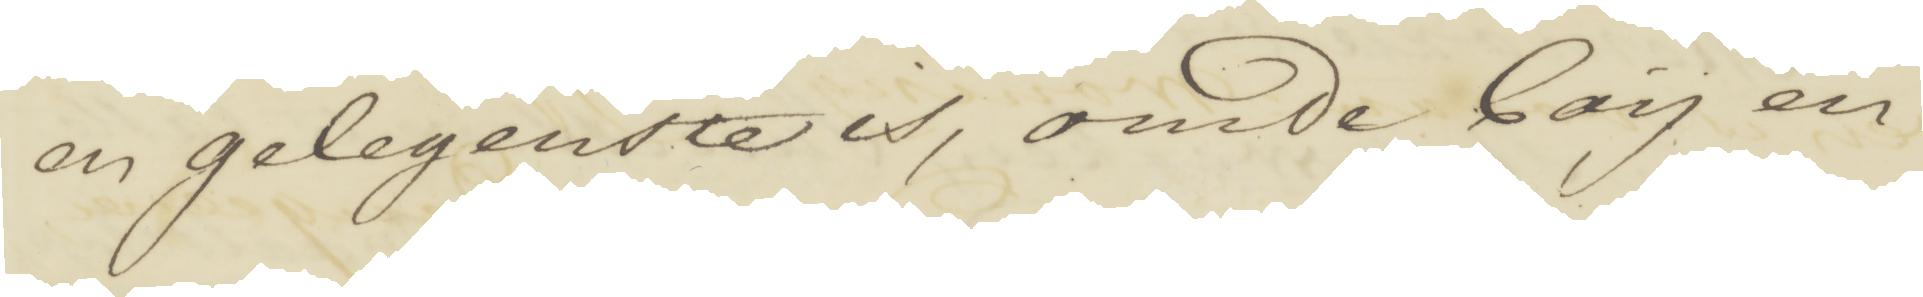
en gelegenste is, om de baij en
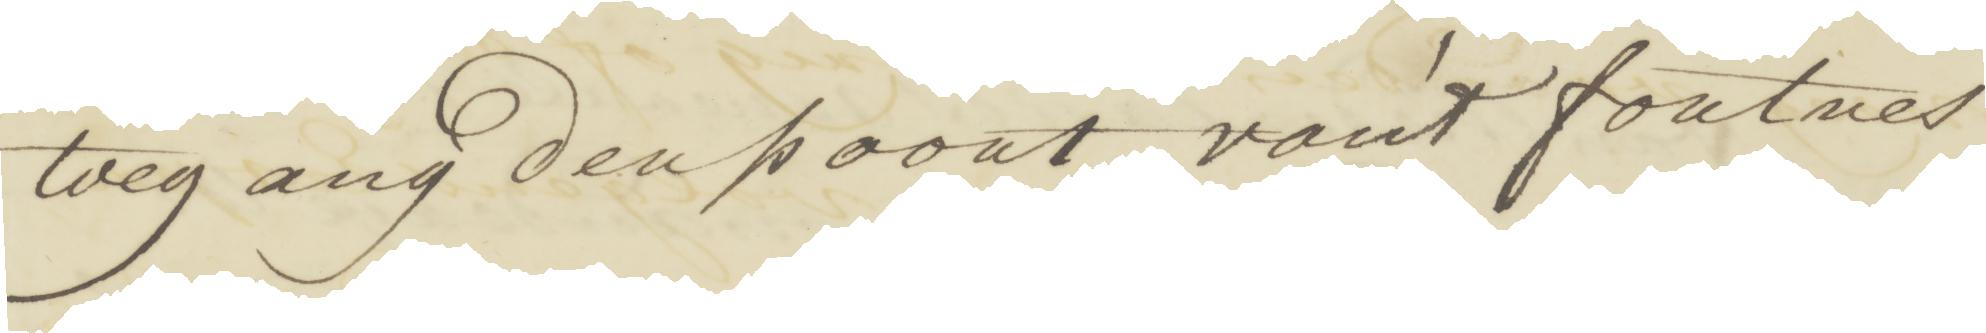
toegang der poort van ’t fortres
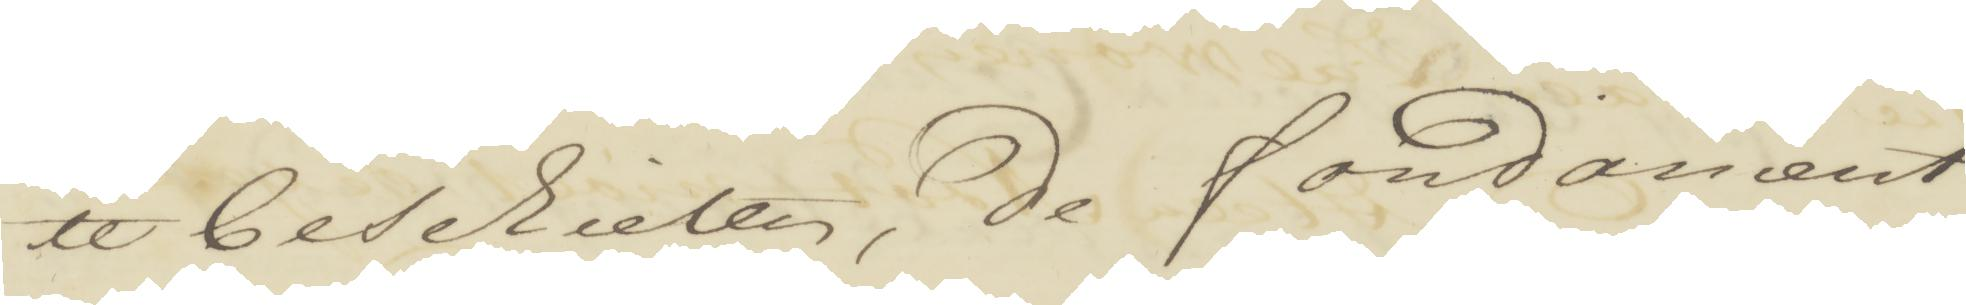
te beschieten, de fondament
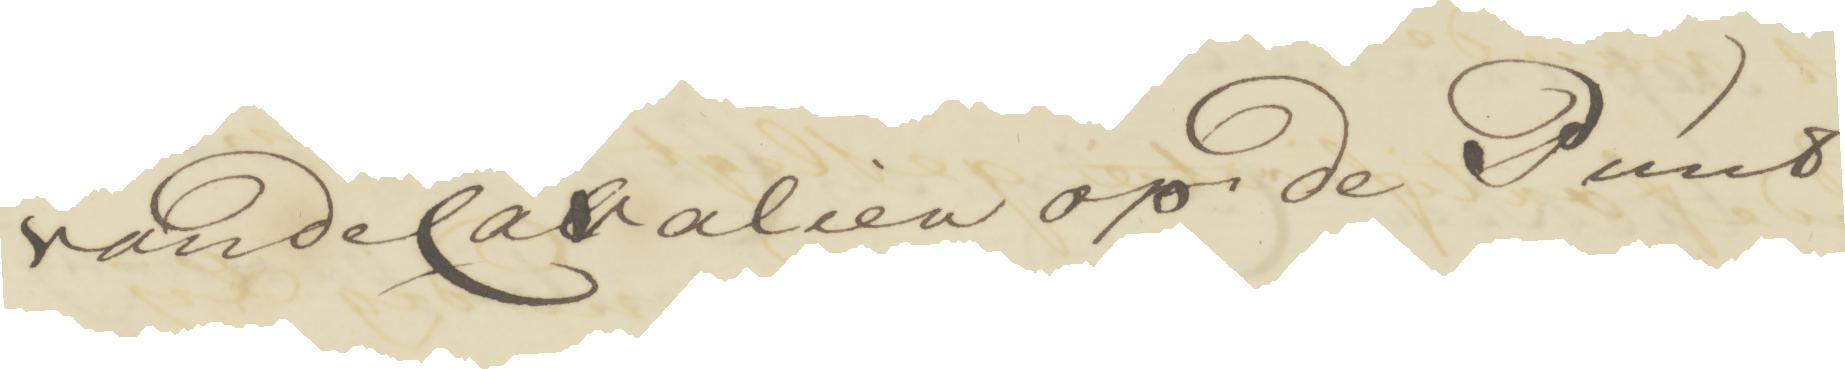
van de Cavalier op de Punt
